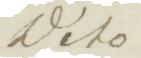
Dito . . . . . . .
